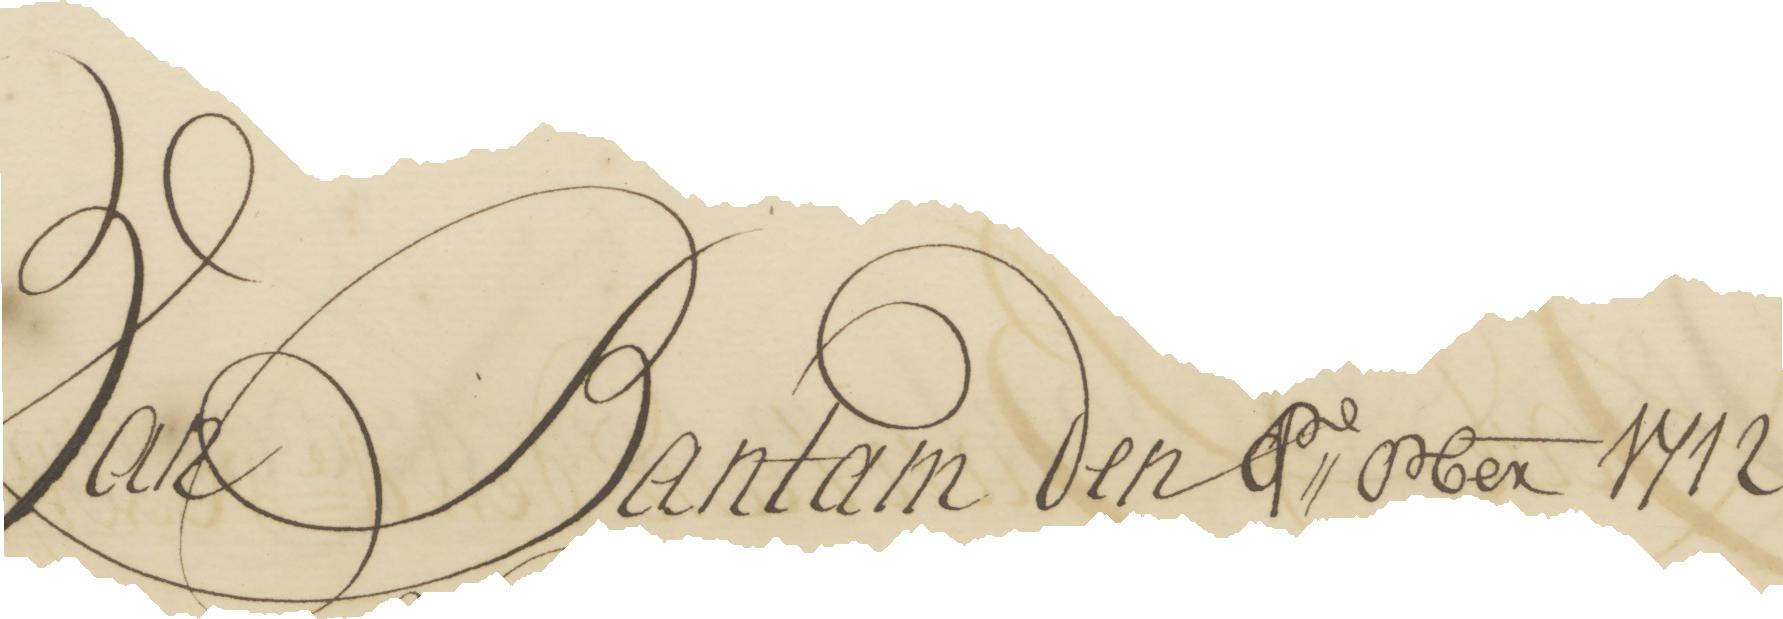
Van Bantam den 4„de 8ber 1712
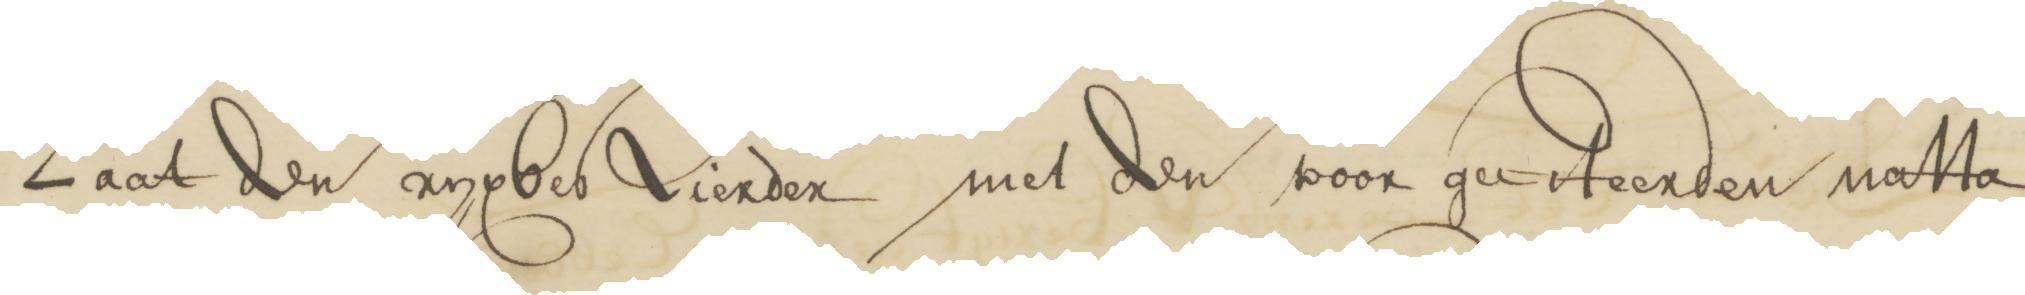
laat den ryxbestierder met den voor geciteerden natta
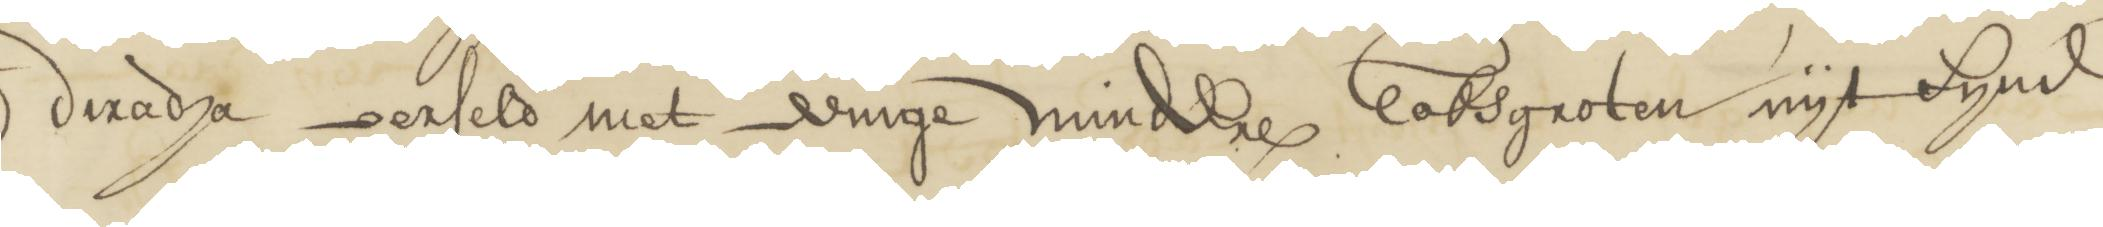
diradja verseld met eenige mindere hofsgroten uijt syne
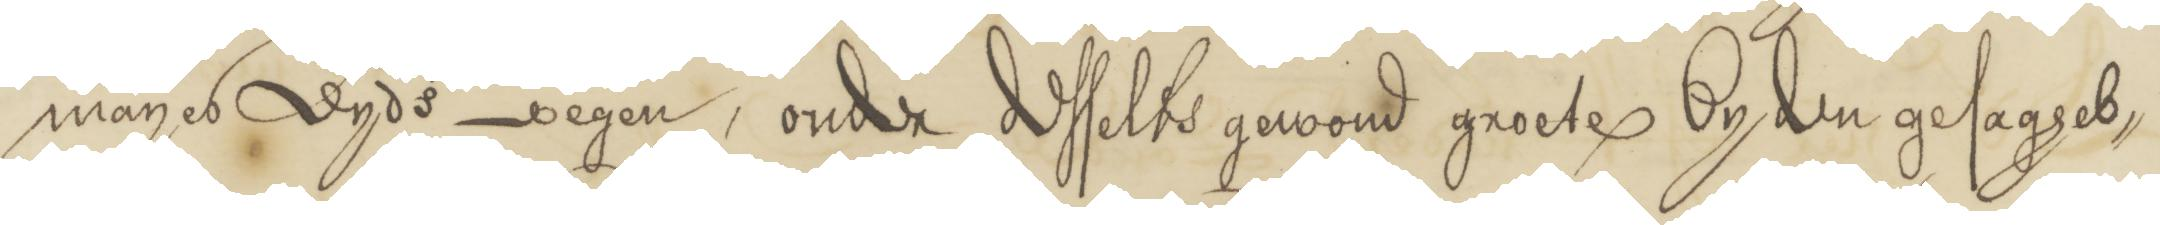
maijesteyds wegen, onder desselfs gewone groete by den gesagheb„
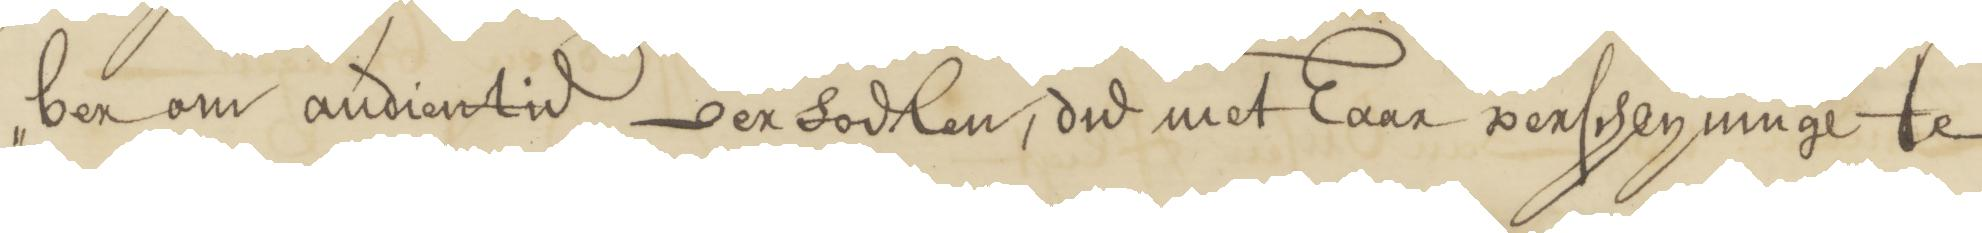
„ ber om audientie versoeken, die met haar verscheyninge te
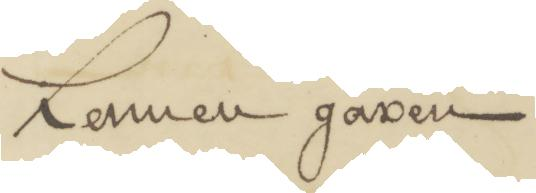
kennen gaven
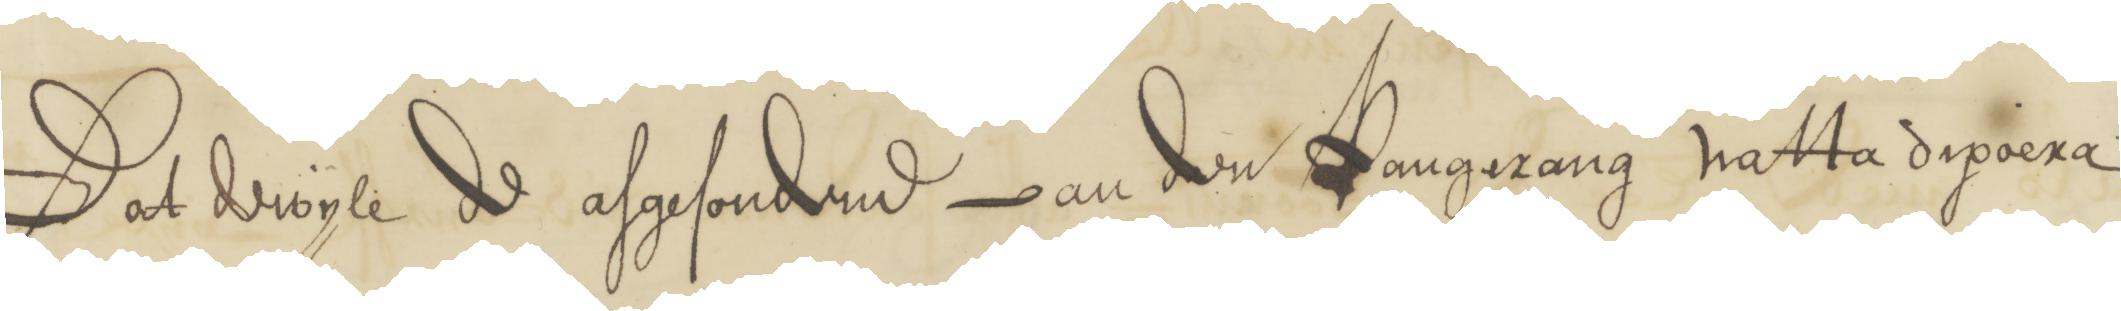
Dat dewijle de afgesondene van den Pangerang natta dipoera
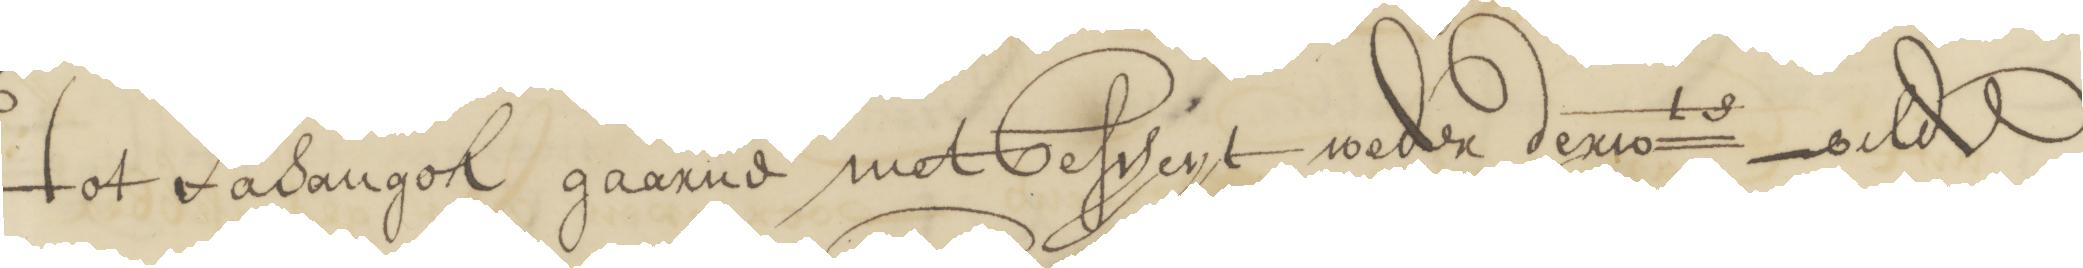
tot sasangok gaarne met bescheyt weder derw=ts wilde
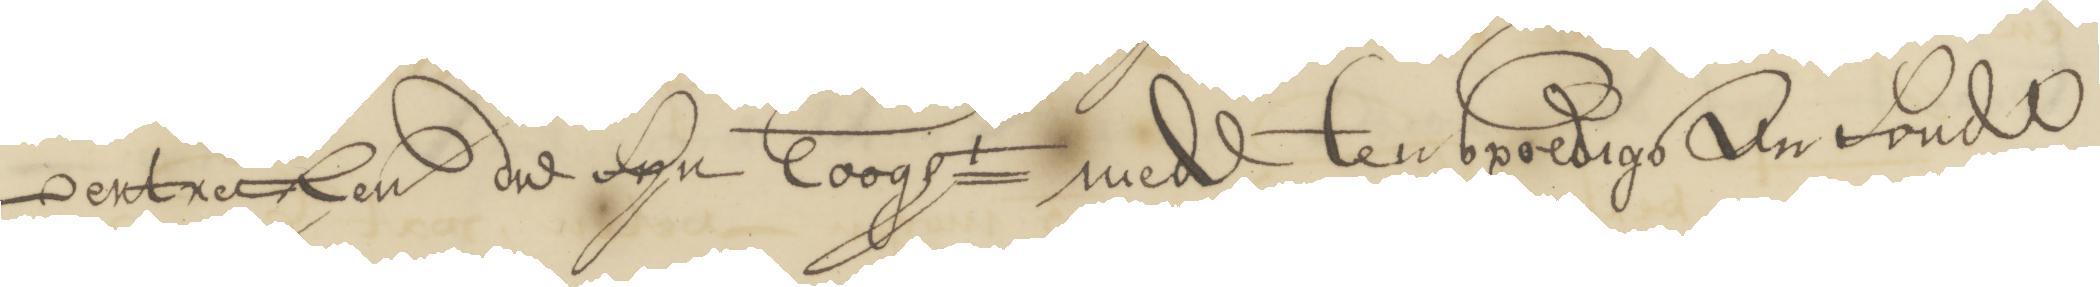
vertrecken die syn hoogh=t mede ten spoedigsten soude
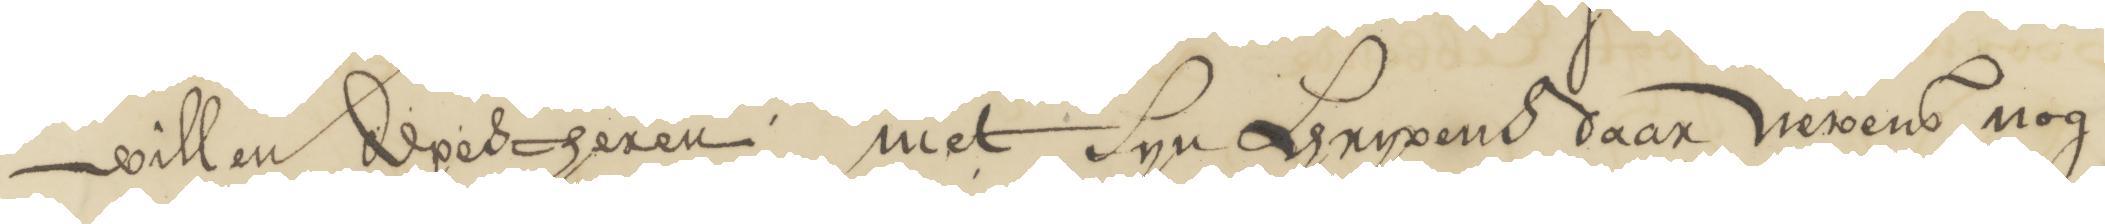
willen depescheren met syn schryvens daar nevens nog
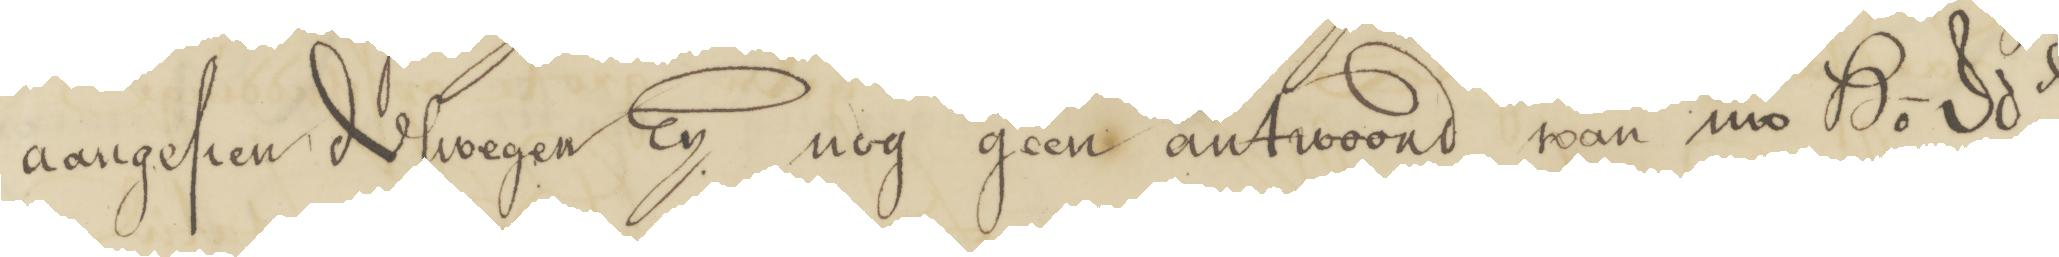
aangesien deswegen hy nog geen antwoord van uw Ho Eds
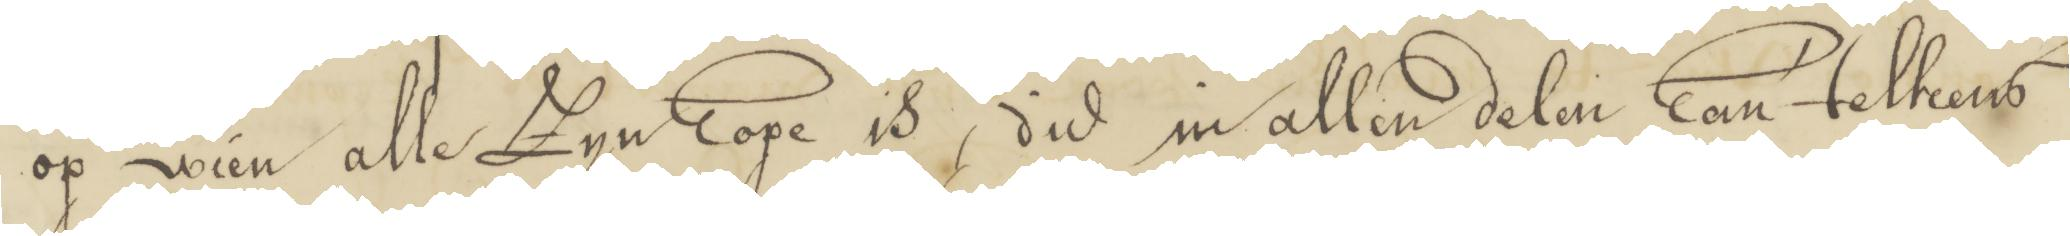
op wien alle Zyn hope is, die in allen delen han 'telkens
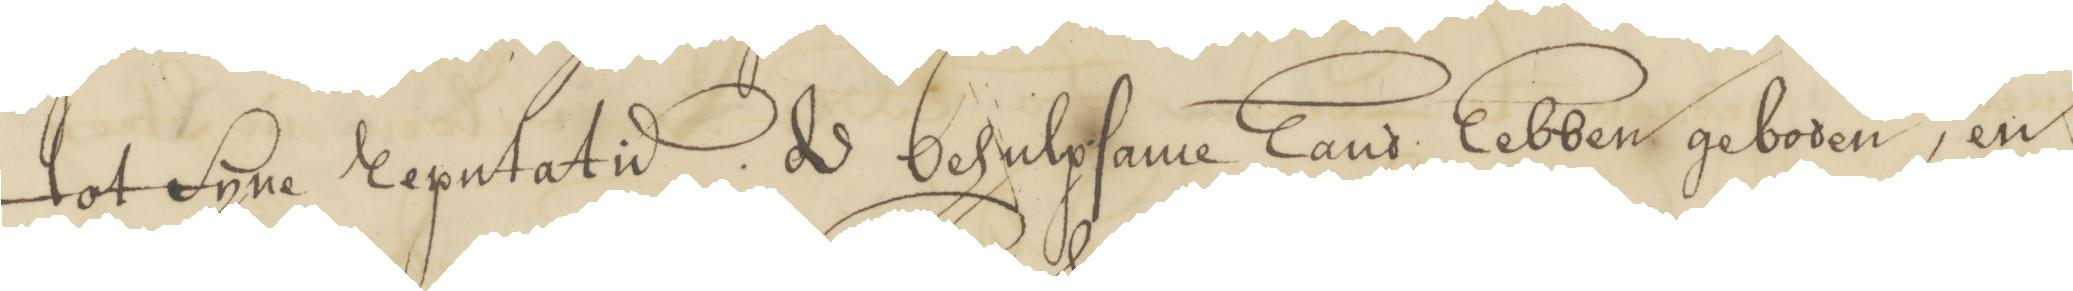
tot syne reputatie de behulpsame hand hebben geboden, en
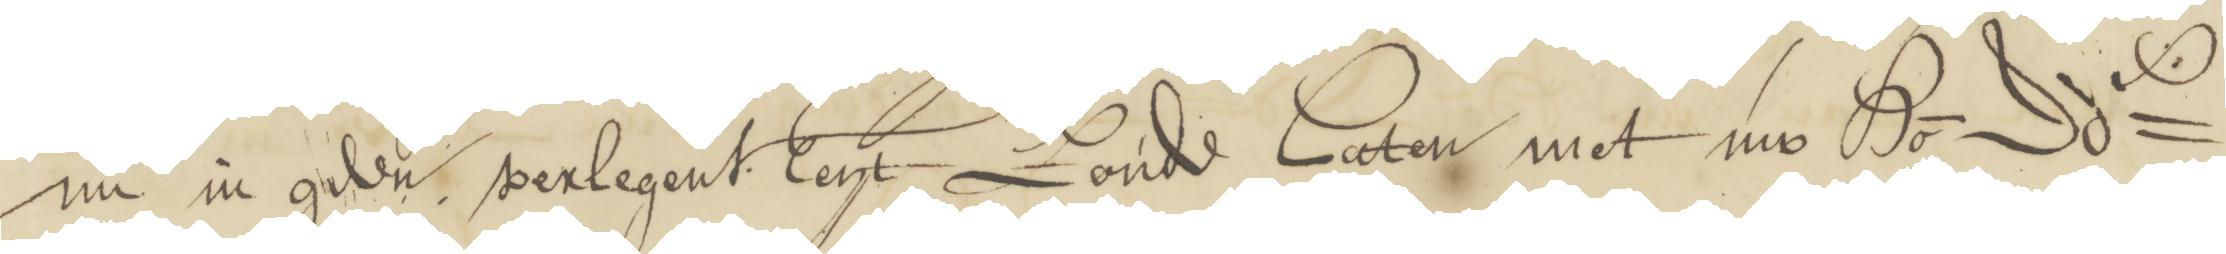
nu in geen verlegentheyt Zoude laten met uw Ho Ed=s
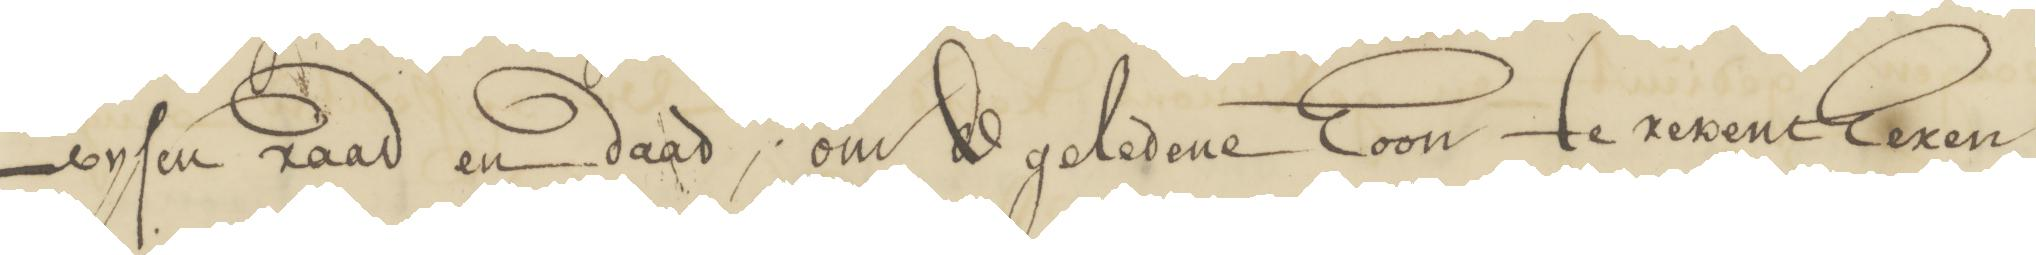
wysen raad en daad, om de geledene hoon te revencheren,
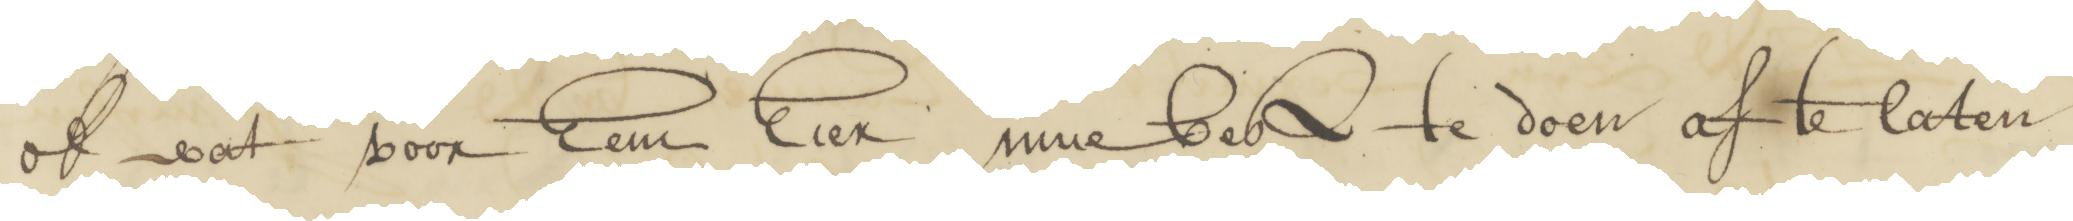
of wat voor hem hier inne best te doen af te laten
